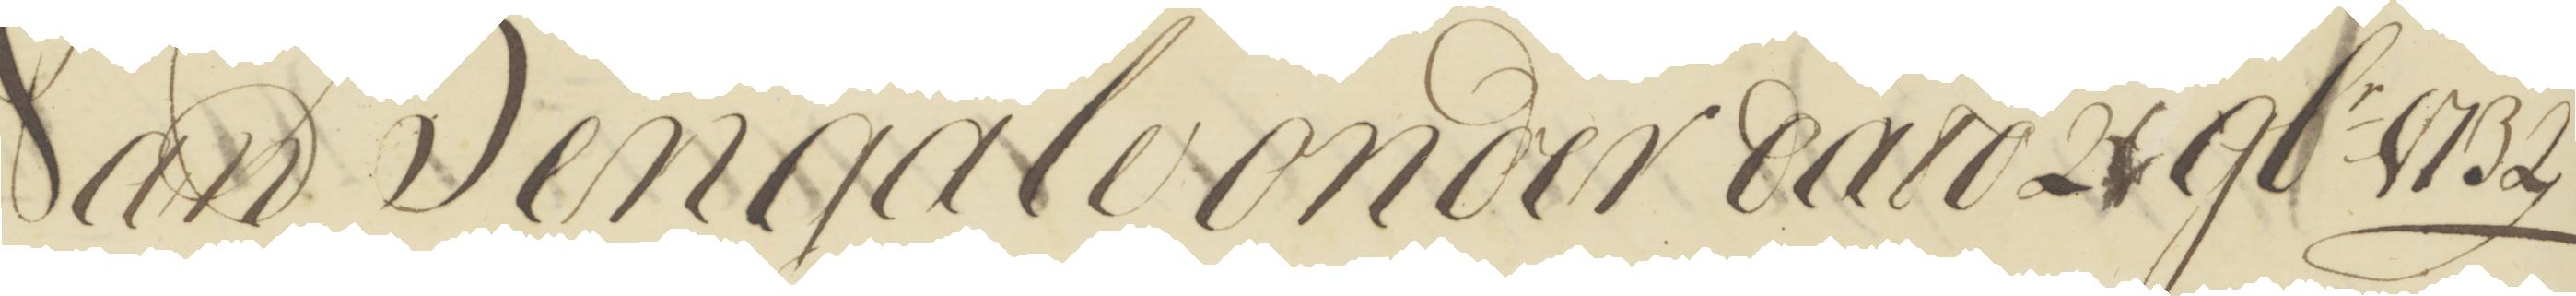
Van Bengale onder dato 21 9b„r 1732
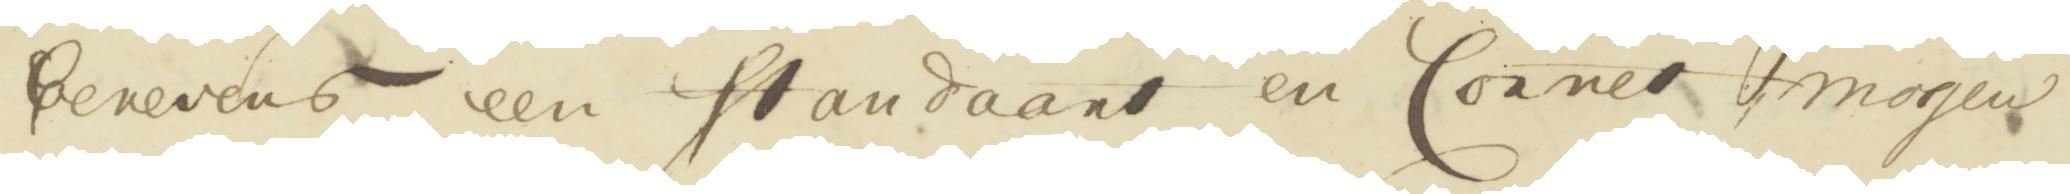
benevens een standaart en Cornet mogen
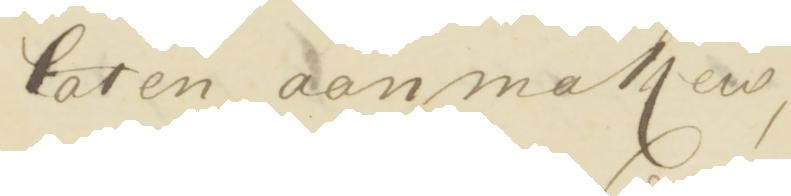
laten aan maken,
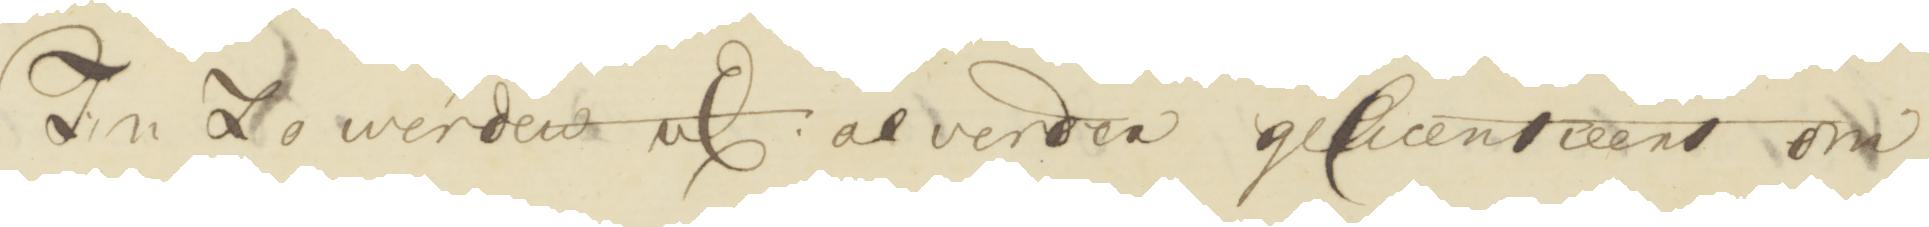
Ten Zo werden uE: al verder gelicentceert om
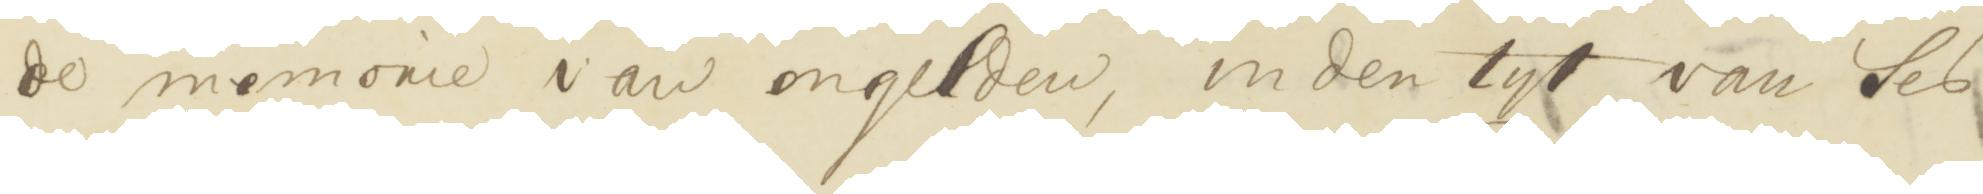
de memorie van ongelden, in den tyt van Ses
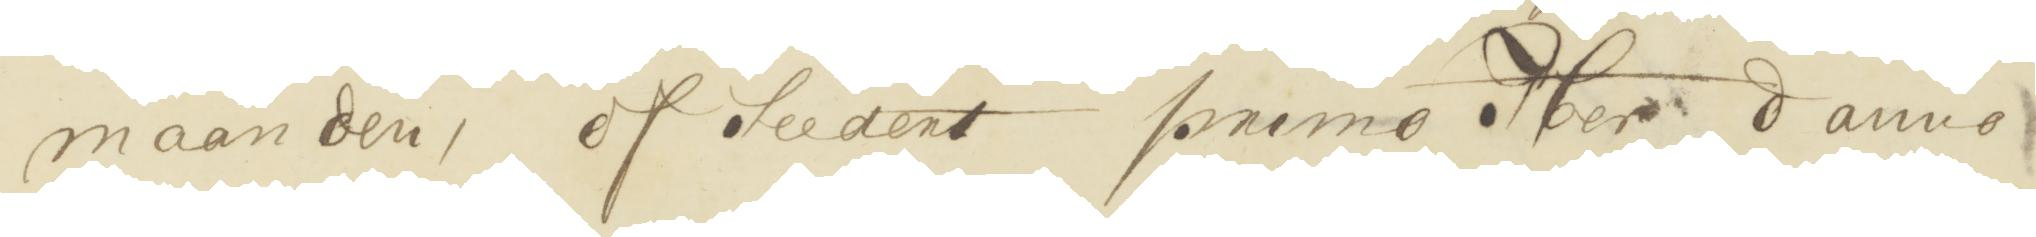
maanden, of Seedert primo 7ber: d anno
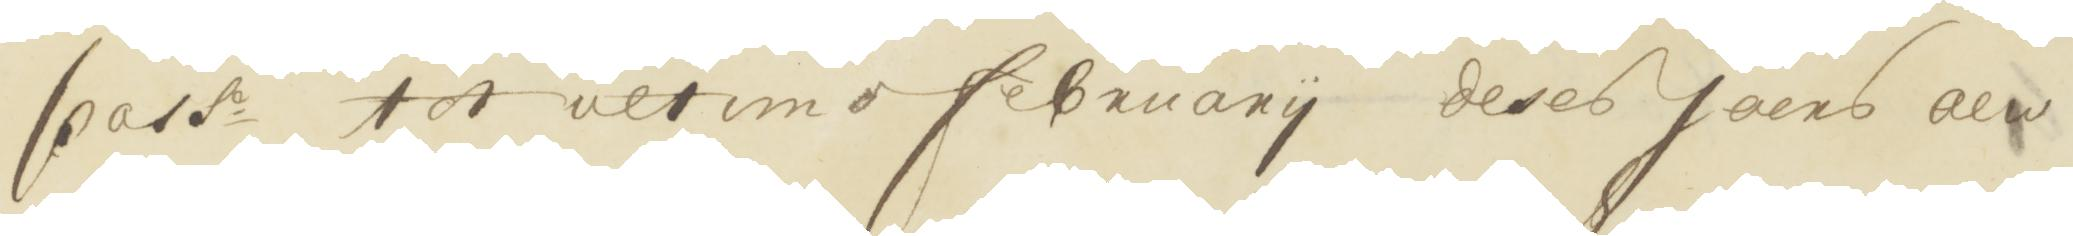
pass=o tot ultimo februarij deses jaers aen
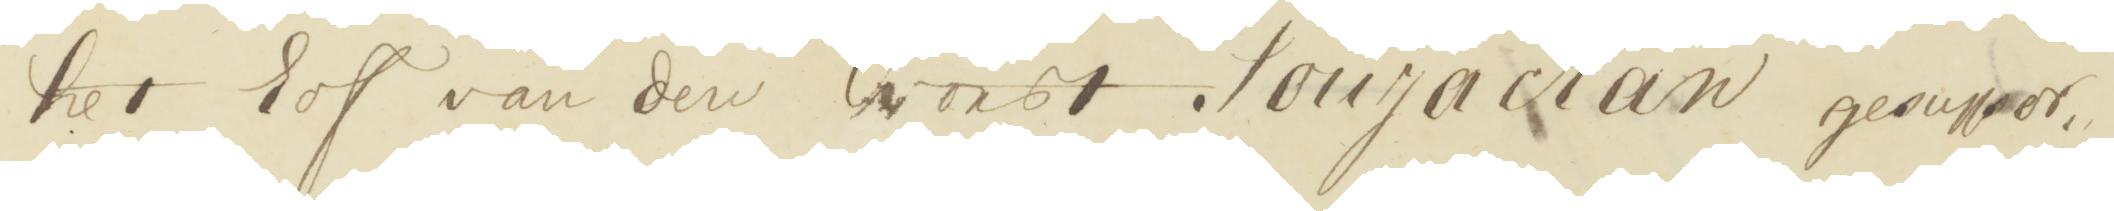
het hof van den vorst Souja chan gesuppor„
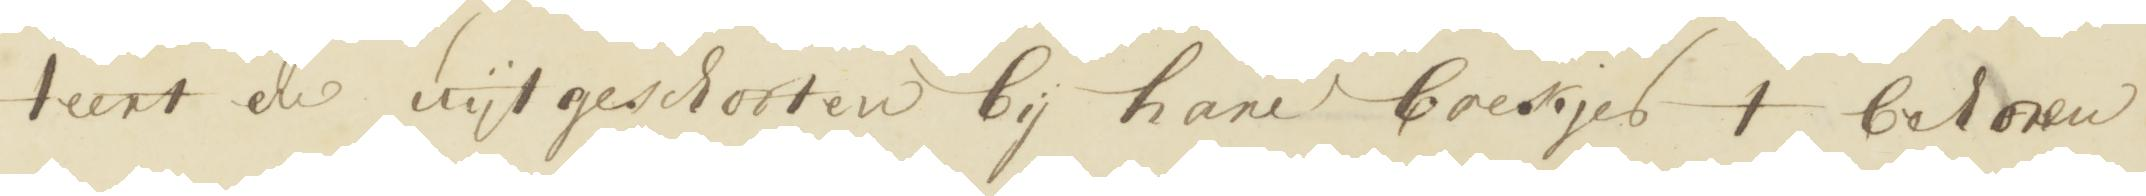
teert en uijtgeschooten bij hare boekjes t behoren
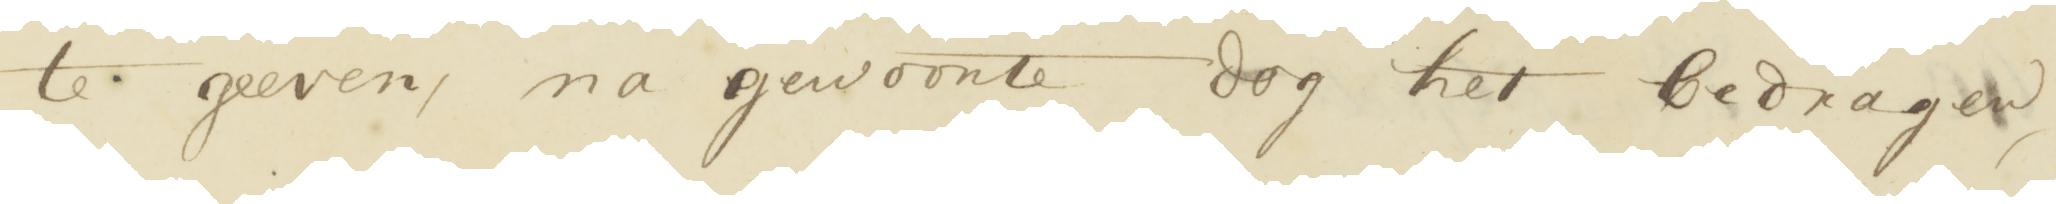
te geeven, na gewoonte dog het bedragen
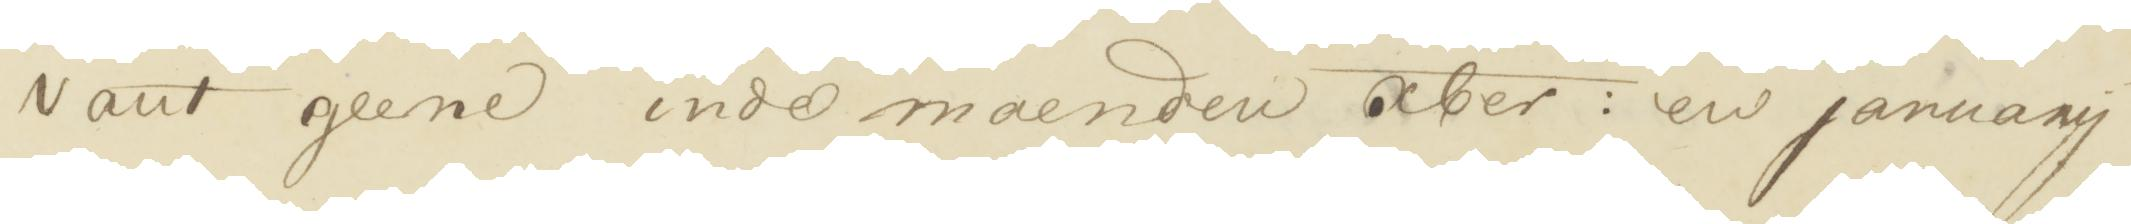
van t geene in de maenden xber: en januarij
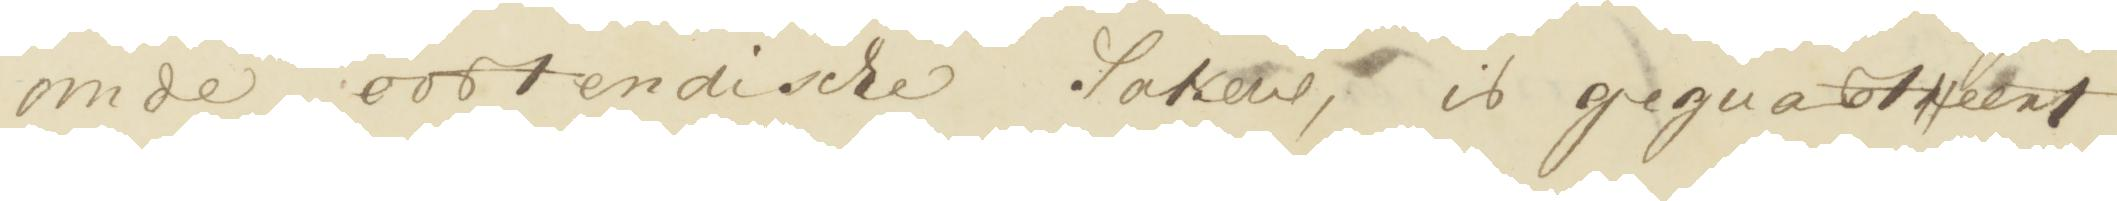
om de oostendische Saken, is geguastreert
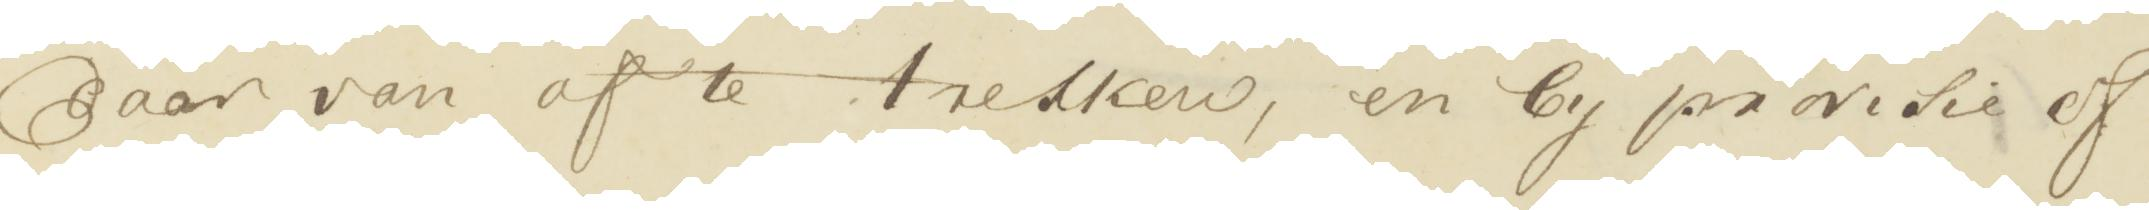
daar van af te trekken, en by provisie of
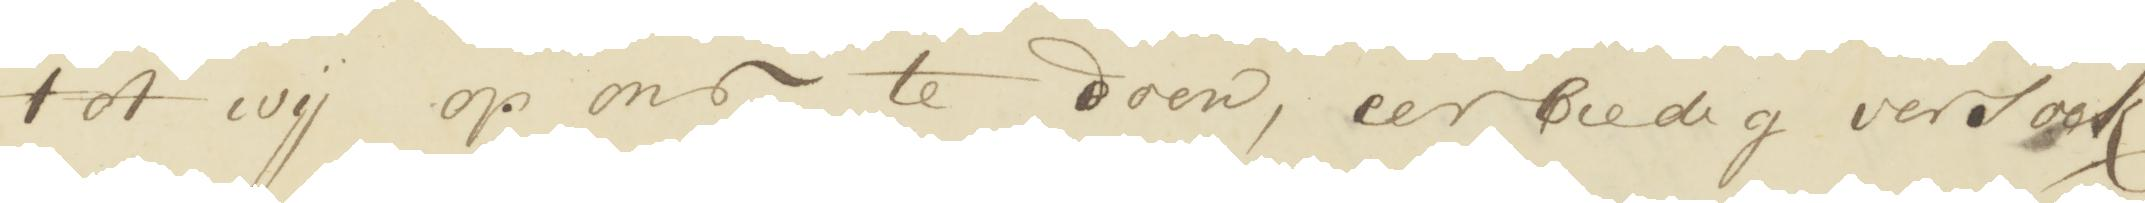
tot wij op ons te doen, eerbiedig versoek
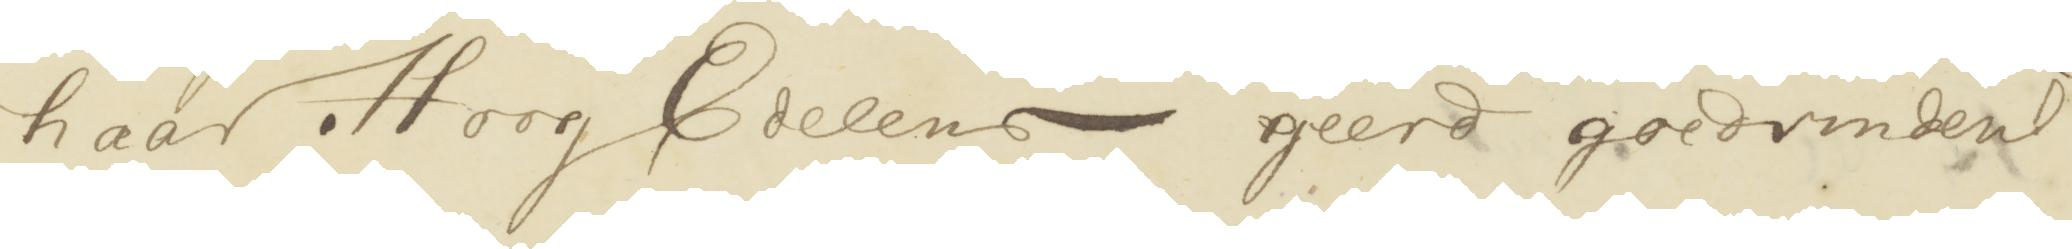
haar Hoog Edelens geerd goedvinden
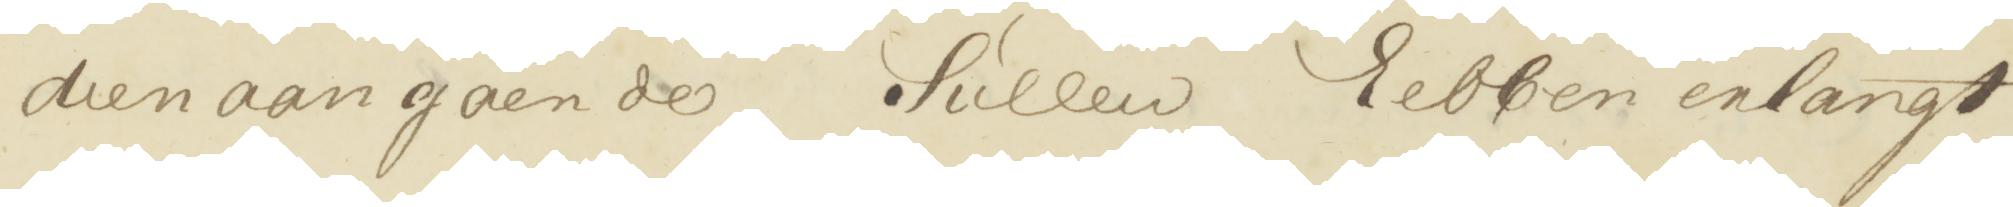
dien aan gaende Sullen hebben erlangt
